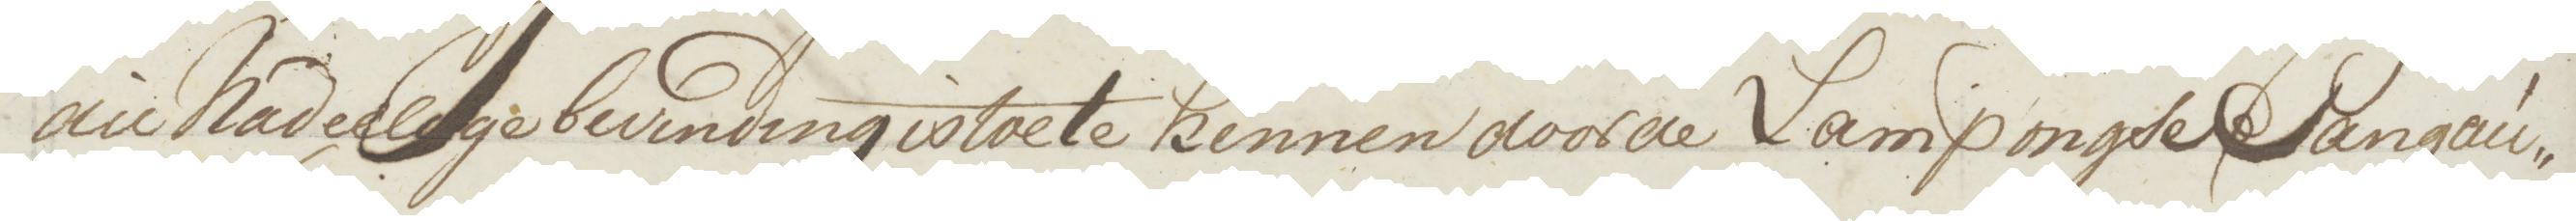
die nadeelige bevinding is toe te kennen door de Lampongse Pangau„
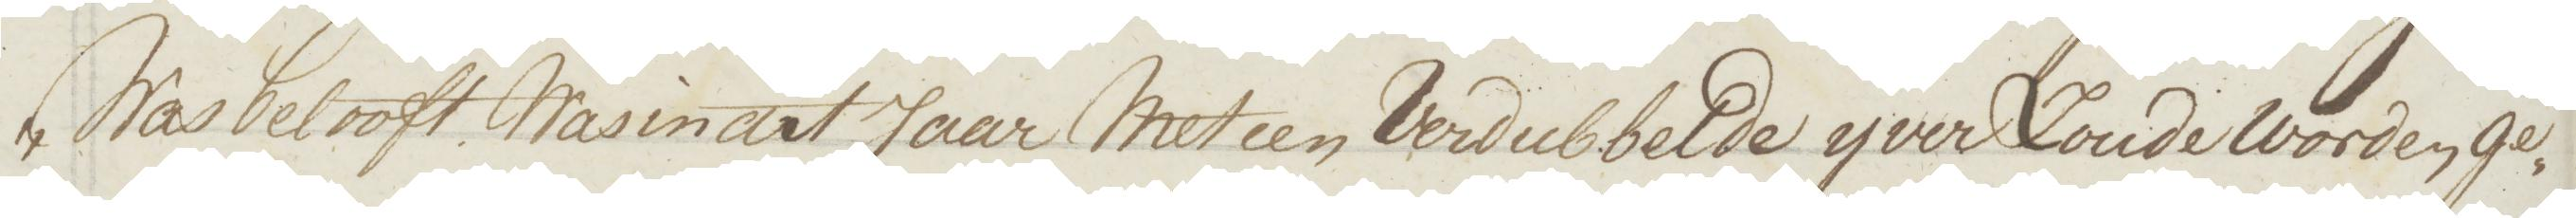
„ was belooft. Was in dit Jaar met een verdubbelde yver zoude worden ge„
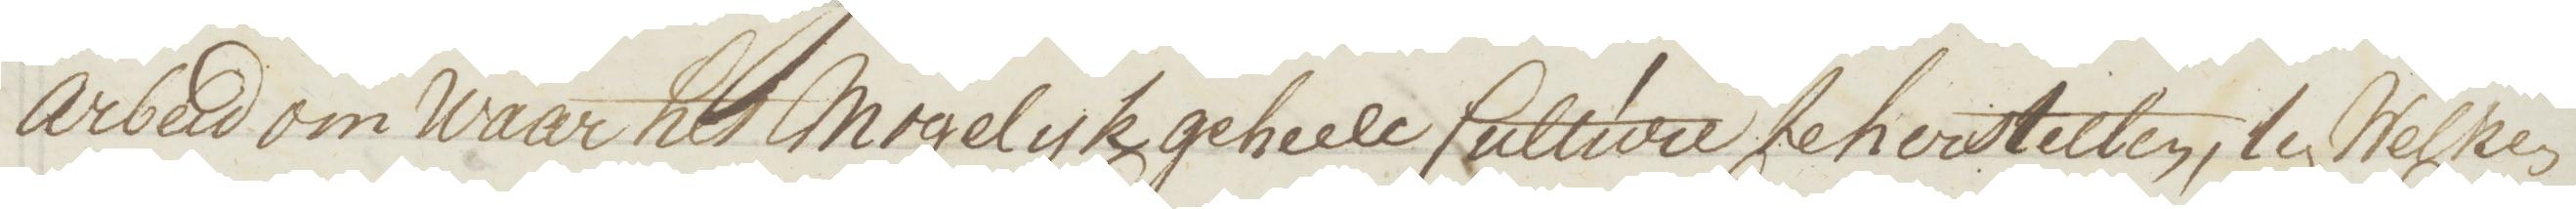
arbeid om waar het mogelyk geheele Culture te herstellen, ten welken
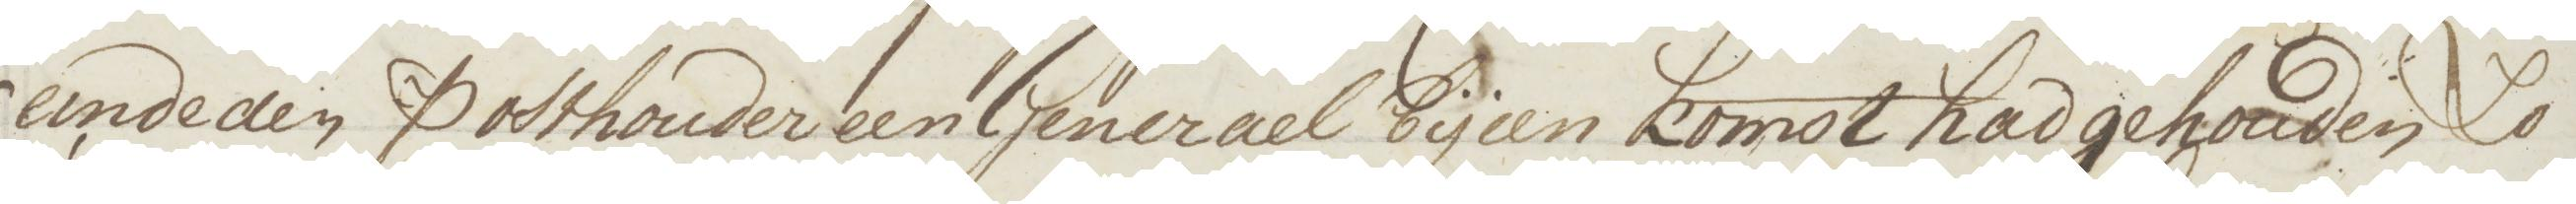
einde den posthouder een Generael bijeen komst had gehouden zo
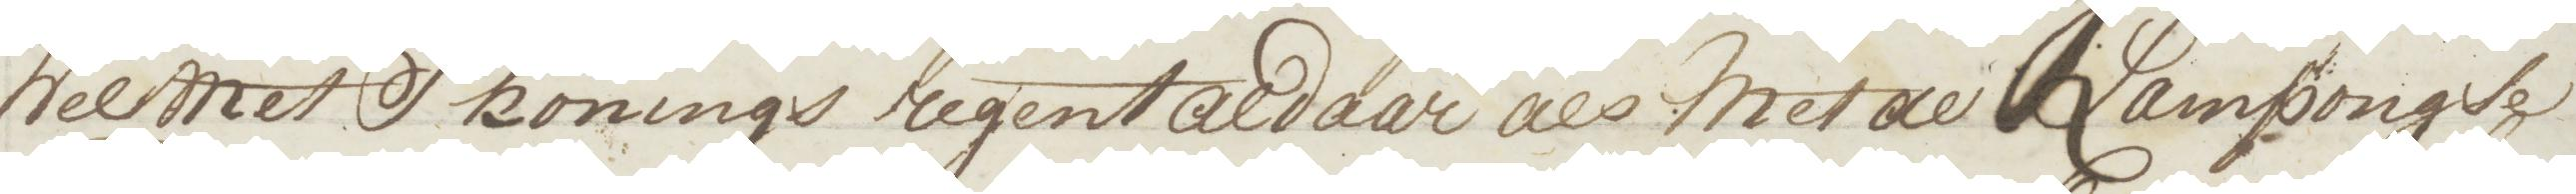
wel met 's konings regent aldaar als met de Lampongse
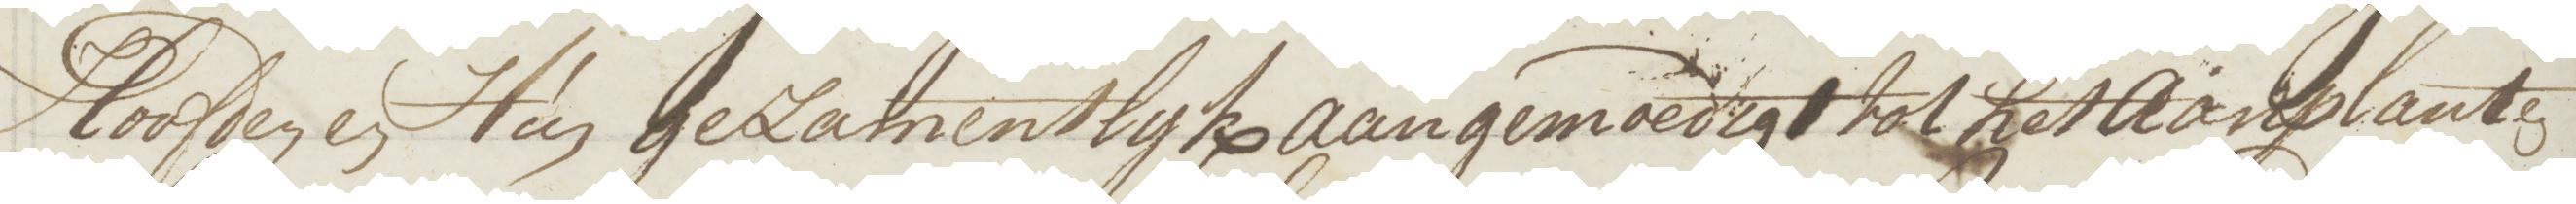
Hoofden en Hun gezamentlijk aangemoedigt tot het aanplanten
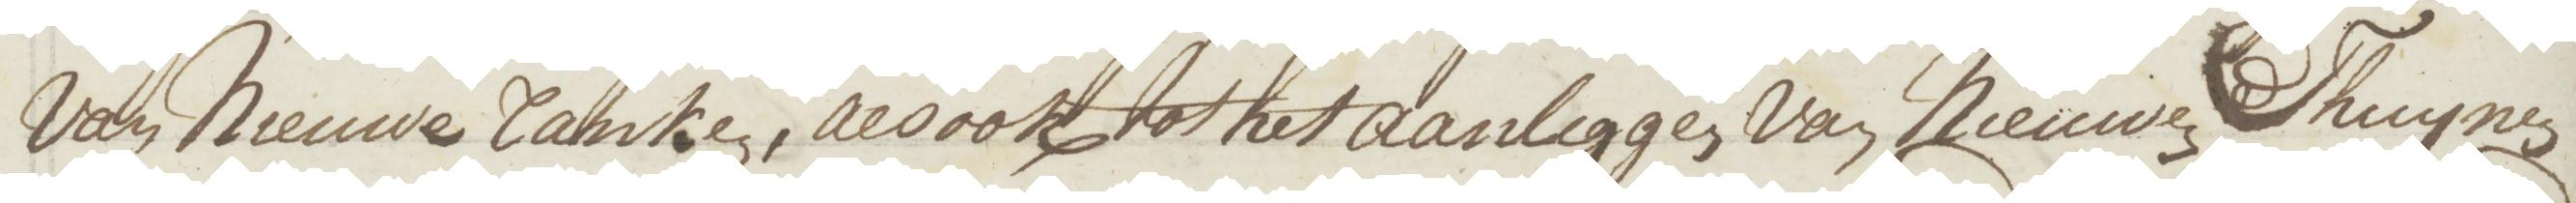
van nieuwe ranken, als ook tot het aanleggen van nieuwen Thuynen
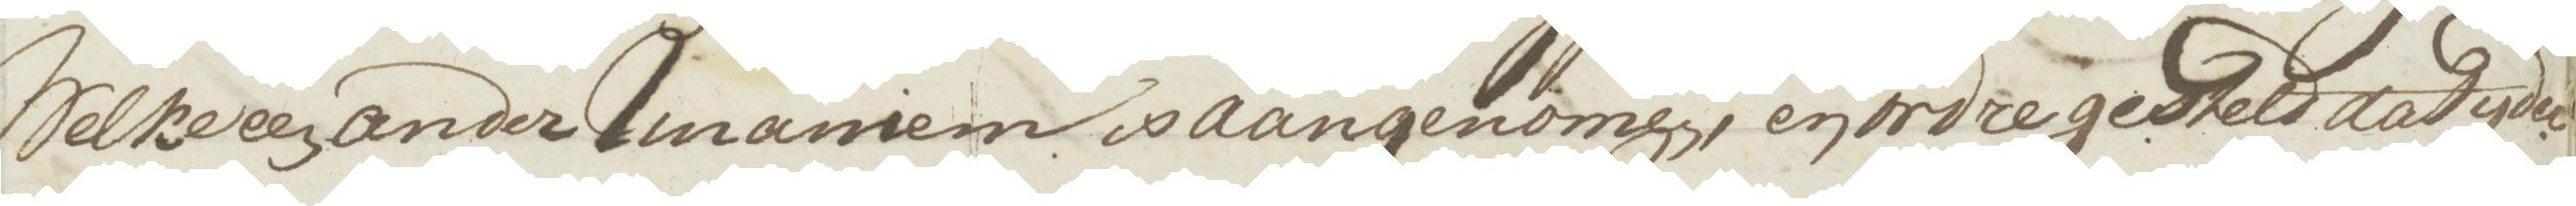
welke een ander Unaniem is aangenomen, en ordre gesteld dat yder
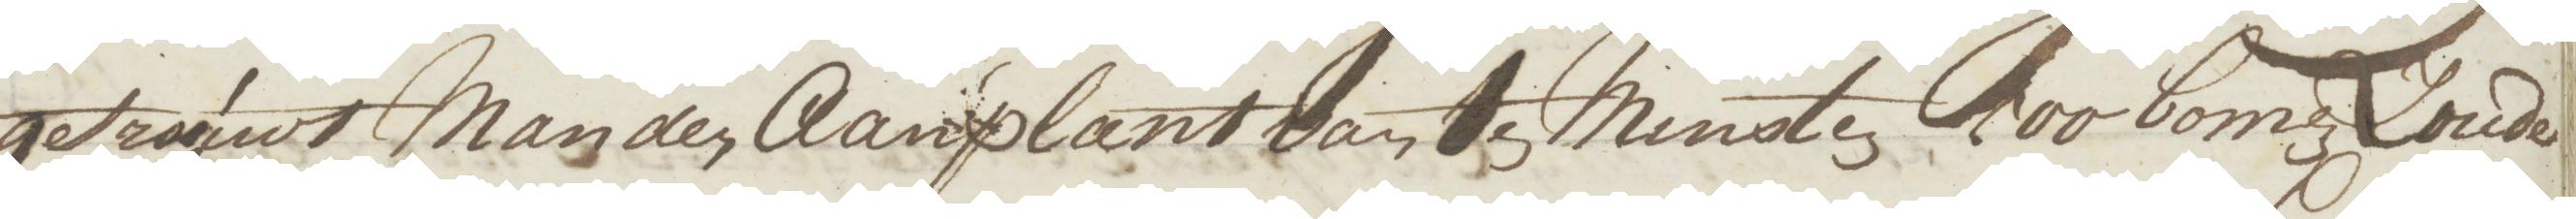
getrouwt man den Aanplant van ten minsten 500 bomen zoude
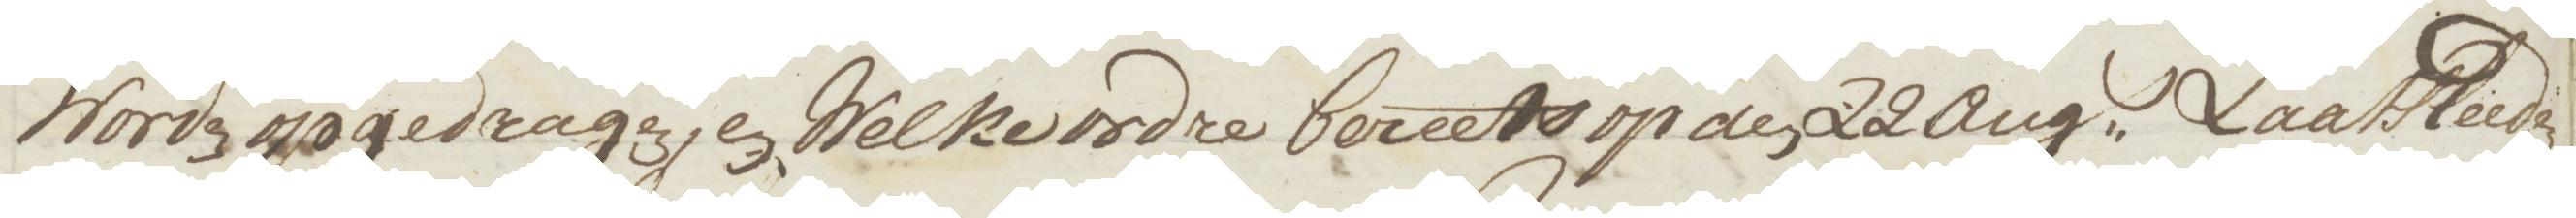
worden opgedragen, en welke ordre bereets op den 22 aug„s Laatsleeden
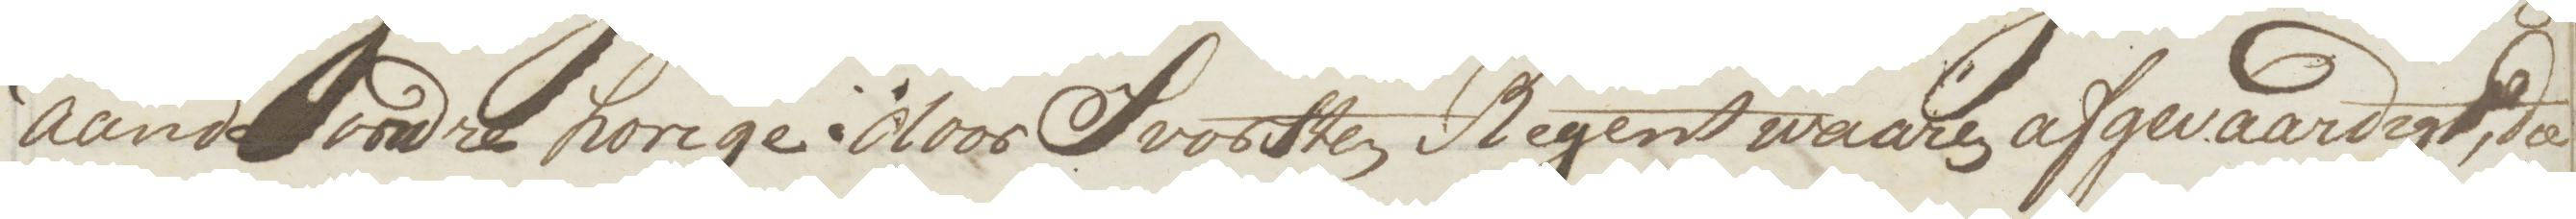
aande ondre horige door svorsten Regent waaren afgevaardigt, die
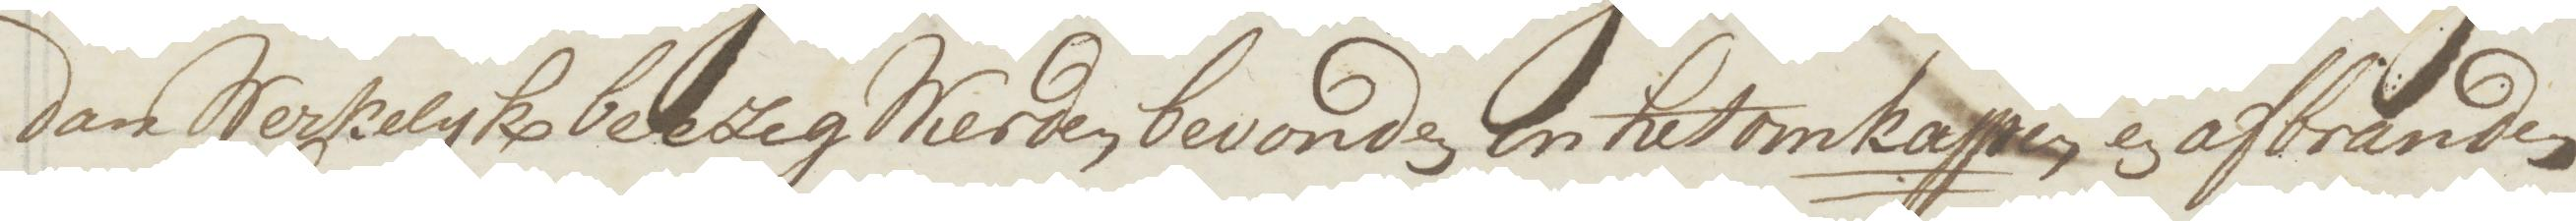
dan werkelijk beezig wierden bevonden in het omkappen en afbranden
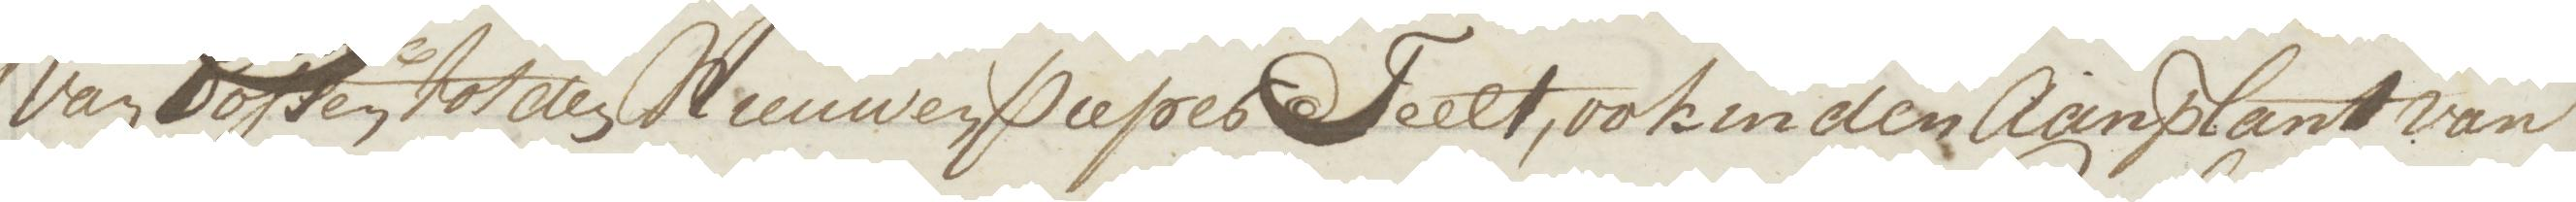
van bossen tot den nieuwen peeper Teelt, ook in den aanplant van
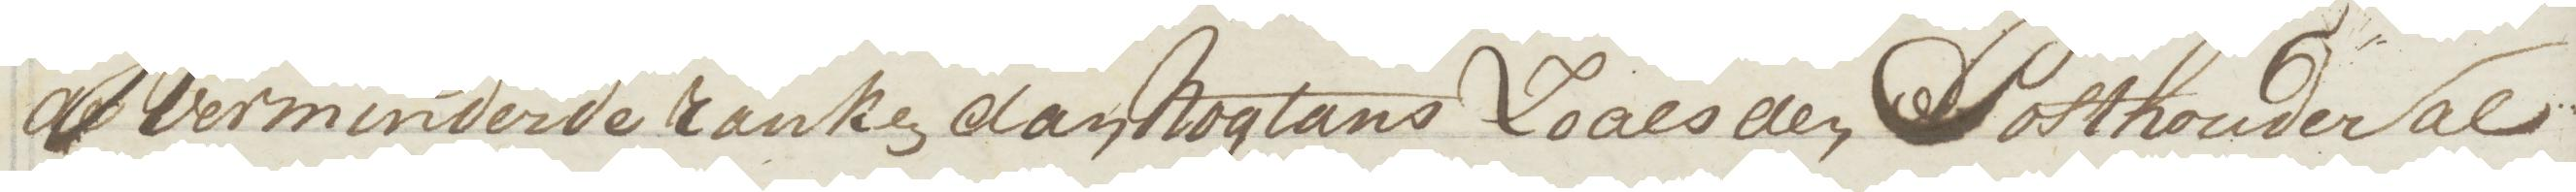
de verminderde ranken dan nogtans zo als den Posthouder al
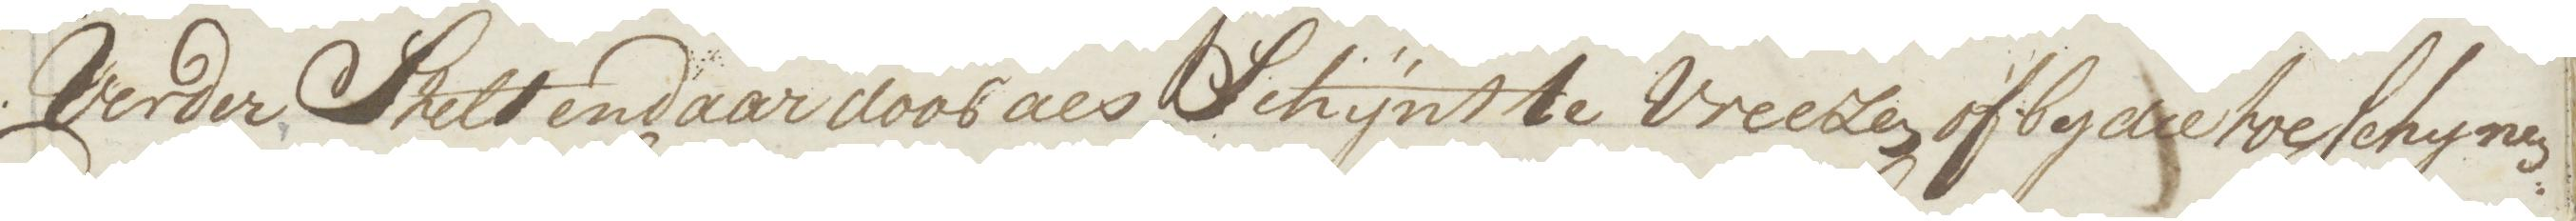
verder stelt en daar door des schijnt te vreezen of by die toeschynen„
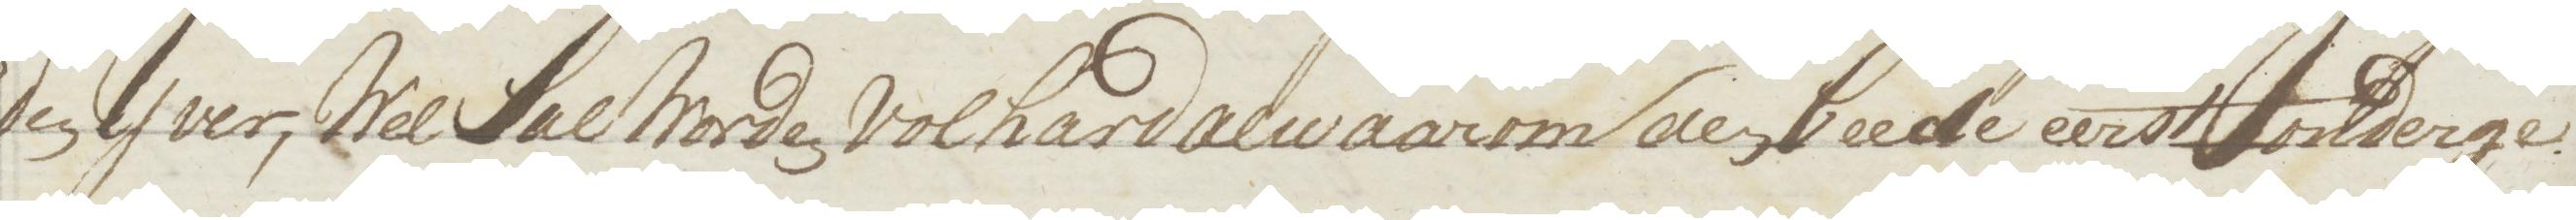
den Yver, wel sal worden volhard alwaarom den beede eerst onderge
